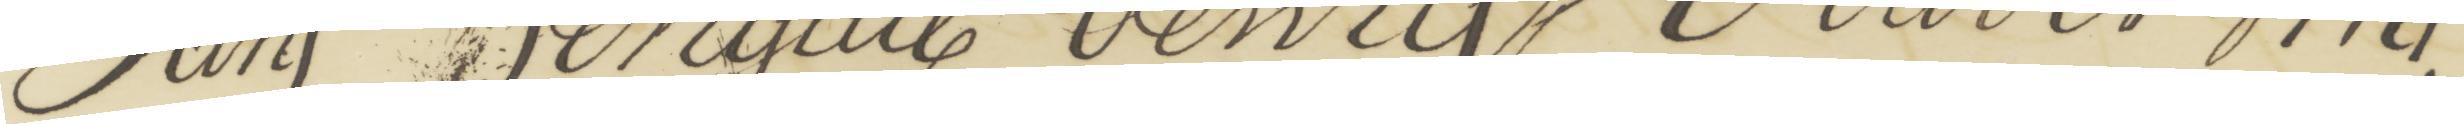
Van Bengale den 29„en October 1714.
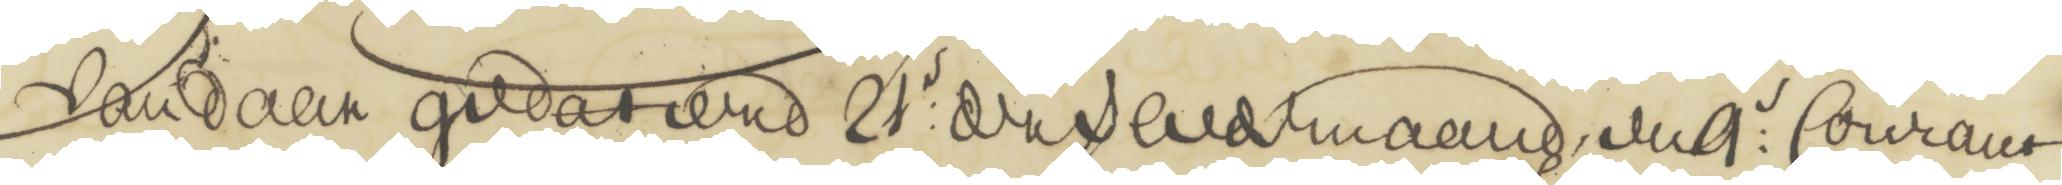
van daar gedateerd 21:e der verlede maand, en 9:e Courant
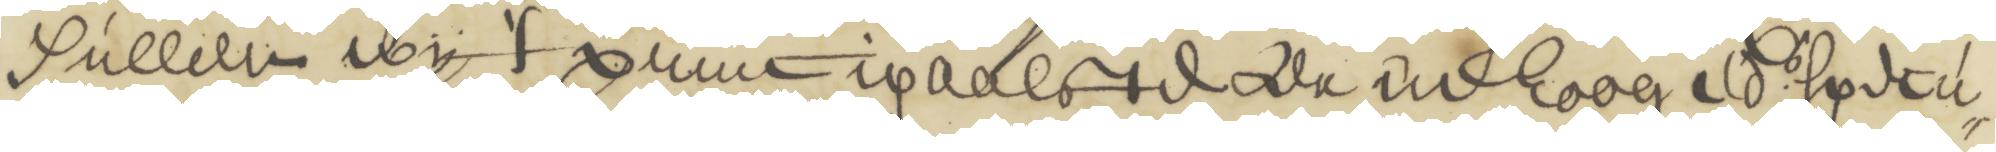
sullen wij 't principaalste ter uEhoog Ed:s specu„
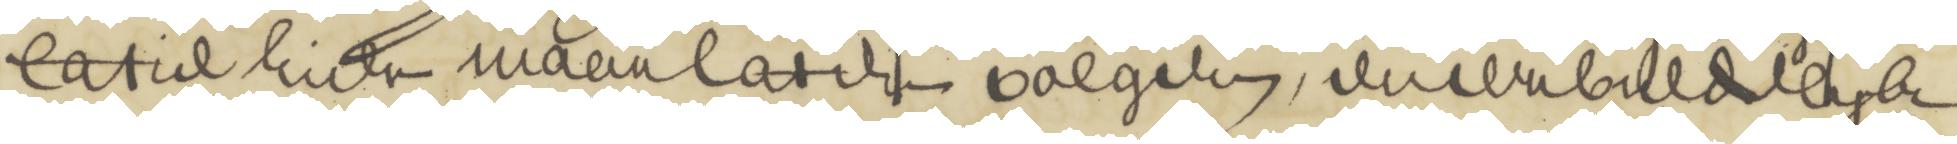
latie hier maar laten volgen, en eerbiedelyk
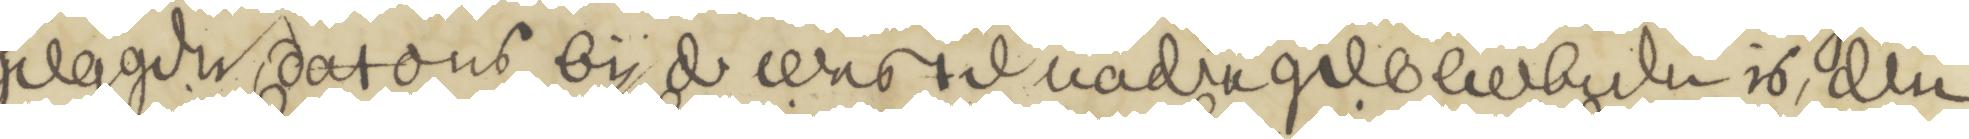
seggen, dat ons bij de eerste nader gebleeken is, den
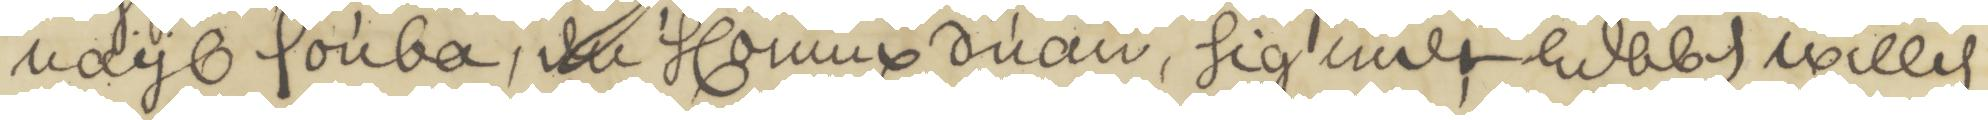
naijb souba, en 's Coninx duan, sig niet hebben willen
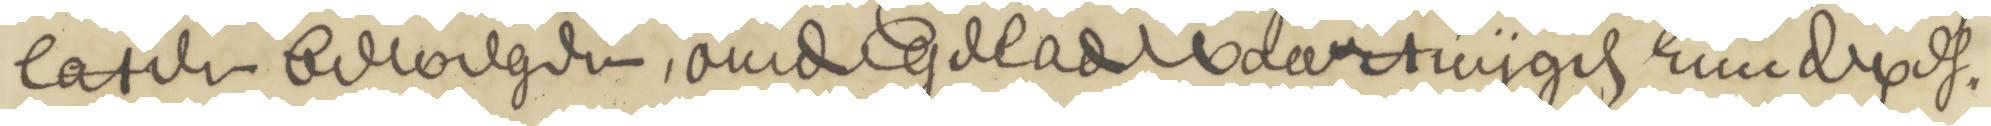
laten bewegen, om de gelade vaartuijgen hun depes„
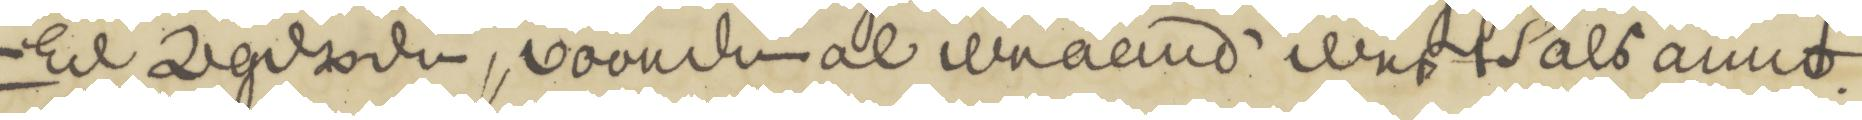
che tegeven, vooren al eer aan d'eerste als anno
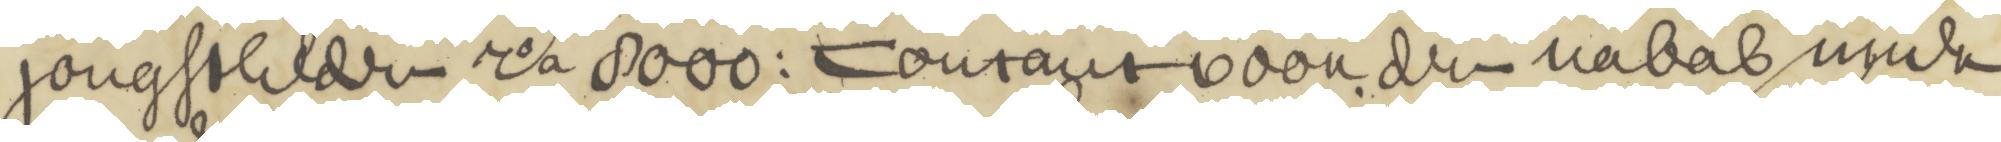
jongstleden ro/a 8000: contant voor den nabab mier
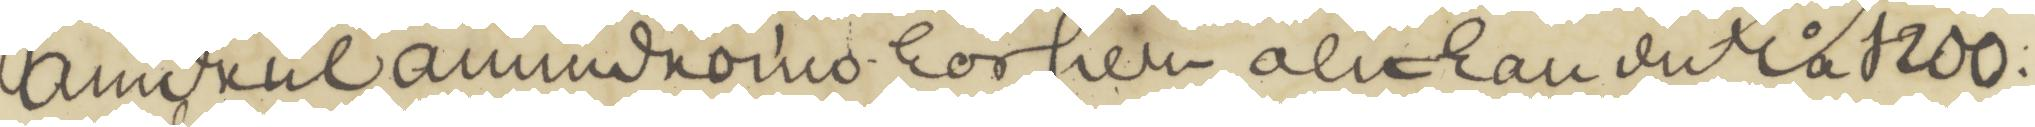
Amerul ammerouw hosseen alichan en ro/a 1200
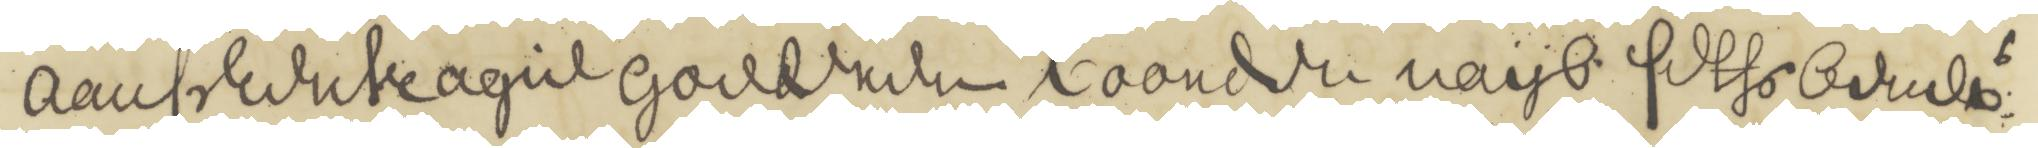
aan schenkagie goederen voor den naijb selfs benev:s
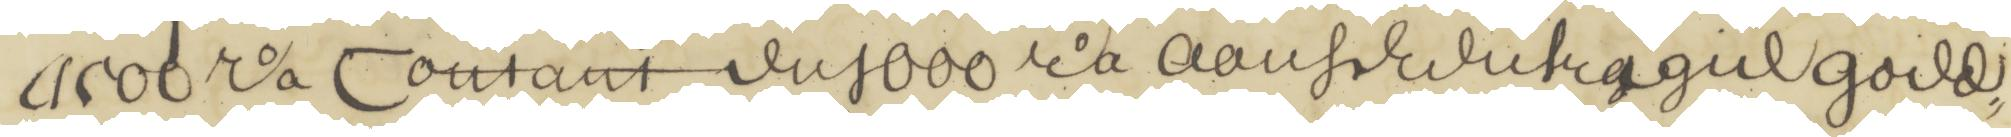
4500 ro/a Contant en 1000 ro/a aan schenkagie goed„
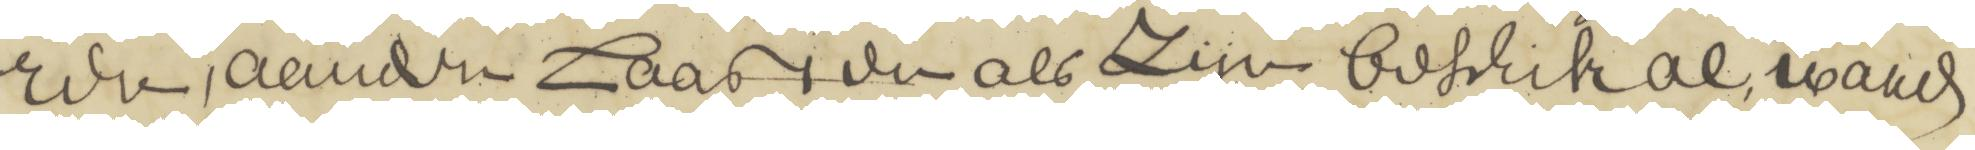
ren, aan den Laasten als zijn beschik al, waren
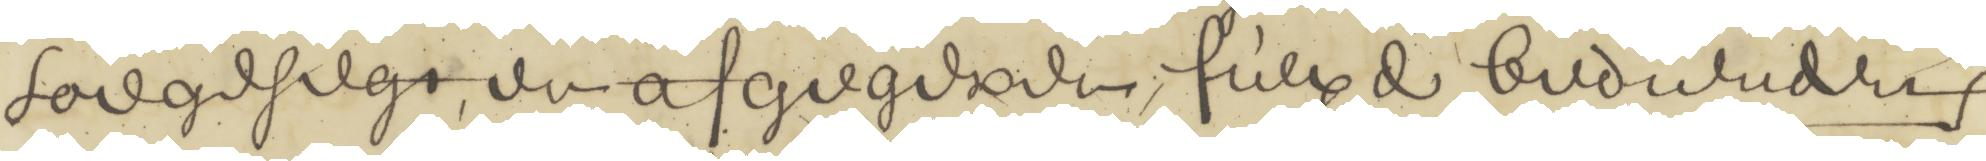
toegesegt, en afgegeven; sulx de bedienden
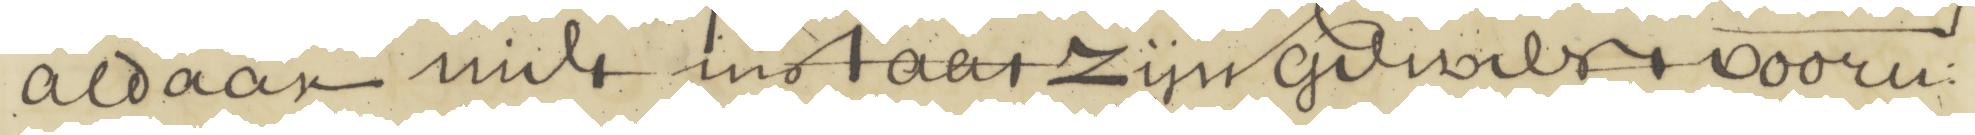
aldaar niet in staat zijn geweest voorn:
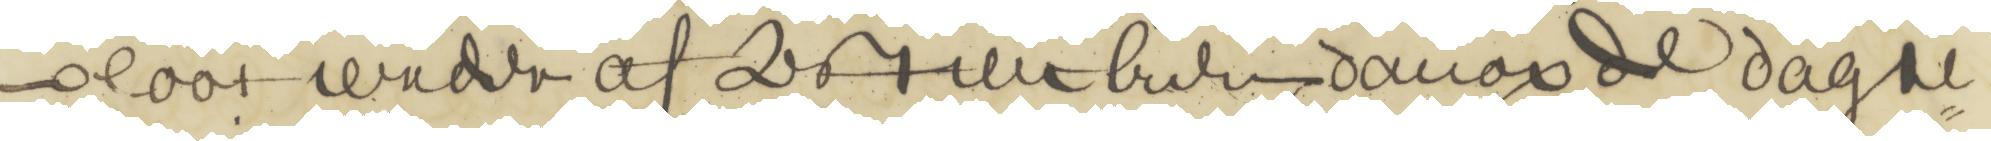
vloot eerder af testeecken dan op de dagte„
